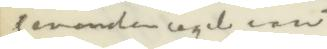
zevenden regel van
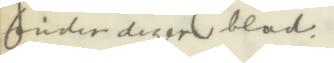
onder dezer blad.
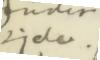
ijde .
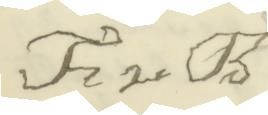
Fr v B
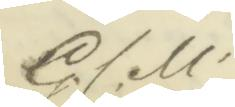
G.C.M'
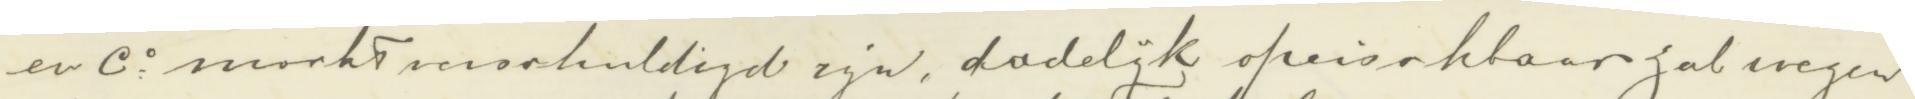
en C=o mocht verschuldigd zijn, dadelijk opeischbaar zal wezen
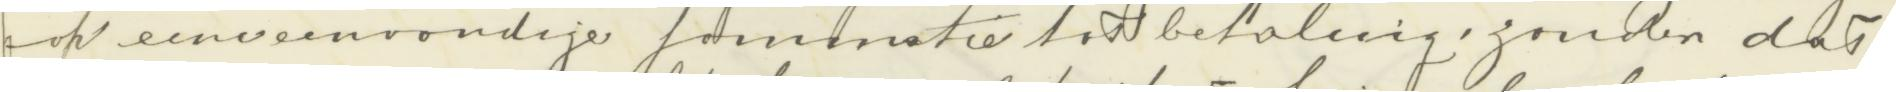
op eene eenvoudige sommatie tot betaling, zonder dat
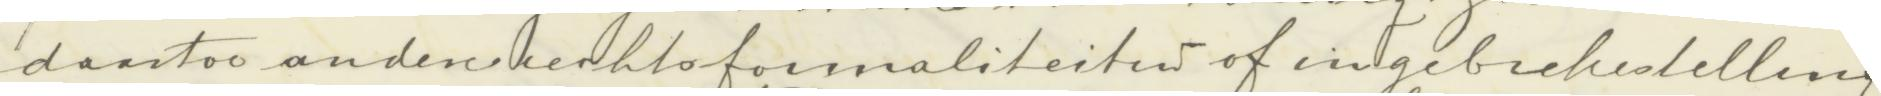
daartoe andere rechtsformaliteiten of ingebrekestelling
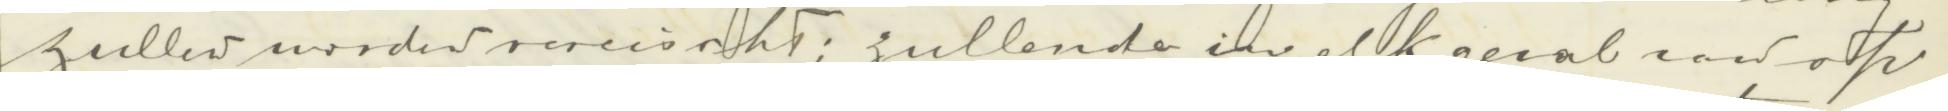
zullen worden vereischt; zullende in elk geval van op
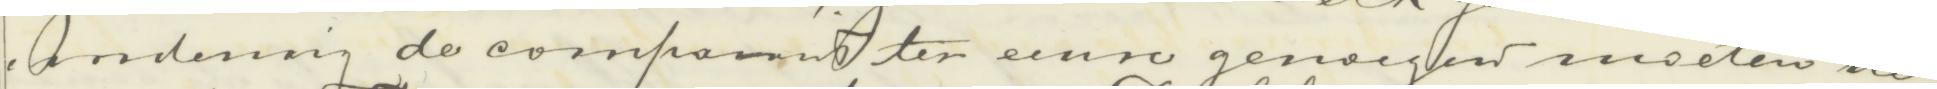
,vordering de comparant ter eenre genoegen moeten ne
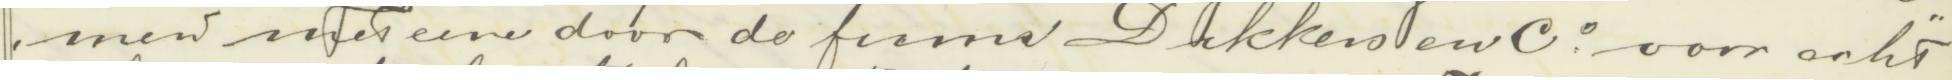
,men met eene door de firma Dikkers en C.o voor echt
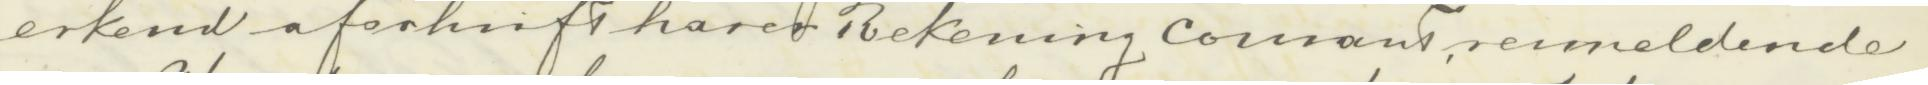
erkend afschrift harer Rekening Courant, vermeldende
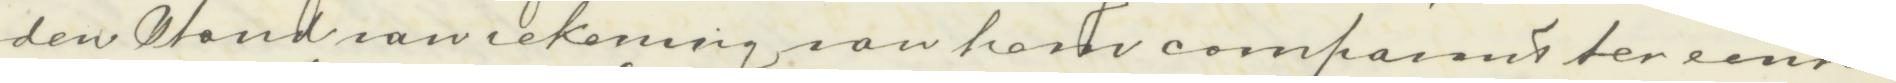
den stand van rekening van hem comparant ter eenre
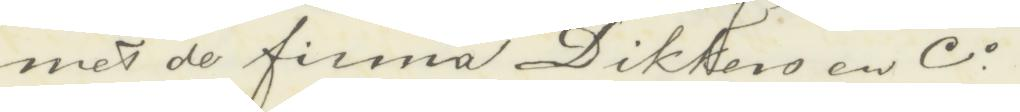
met de fima Dikkers en C.o
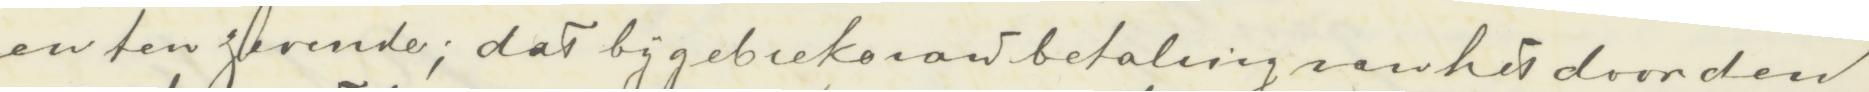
en ten zevende; dat bij gebreke van betaling van het door den
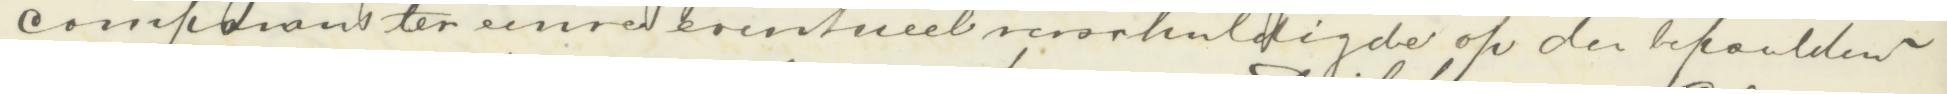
comparant ter eenre eventueel verschuldigde op den bepaalden
